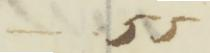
-. 55
